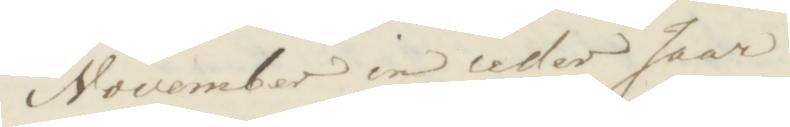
November in ieder Jaar
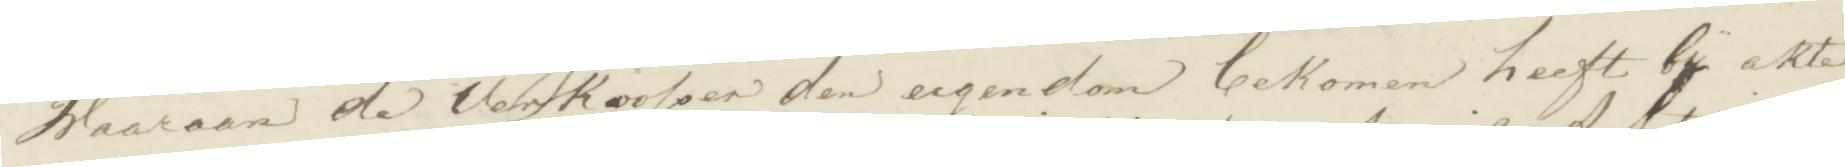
Waaraan de verkooper den eigendom bekomen heeft bij akte
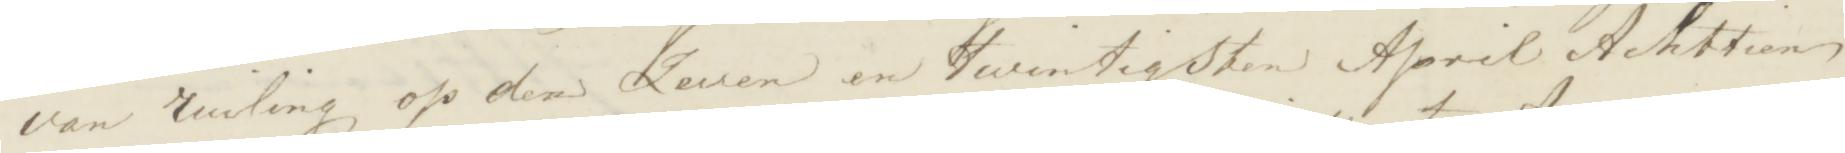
van ruiling op den zeven en twintigsten April Achttien
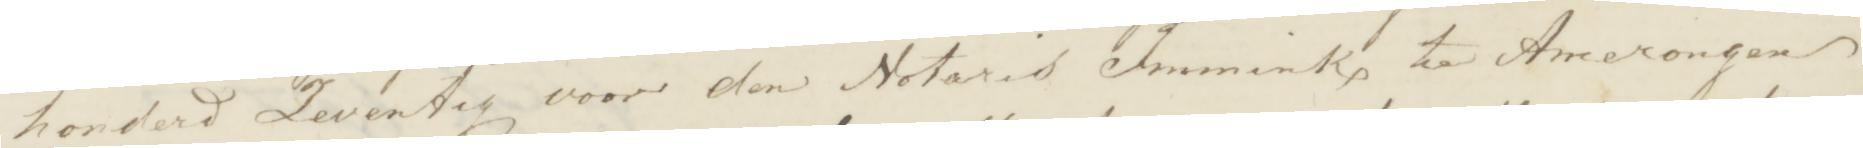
honderd zeventig voor den Notaris Immink te Amerongen
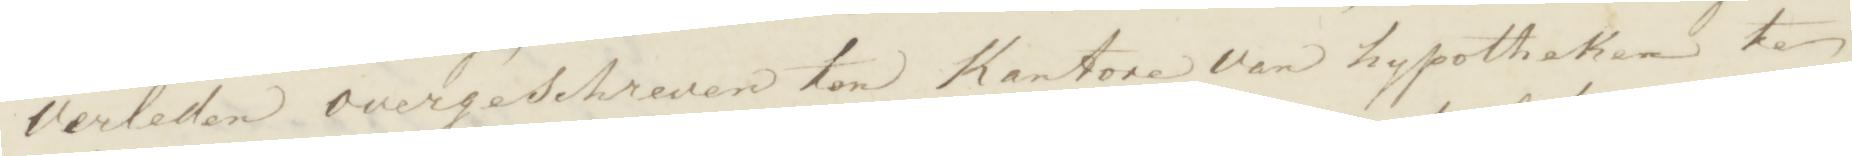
verleden overgeschreven ten kantore van hypotheken ten
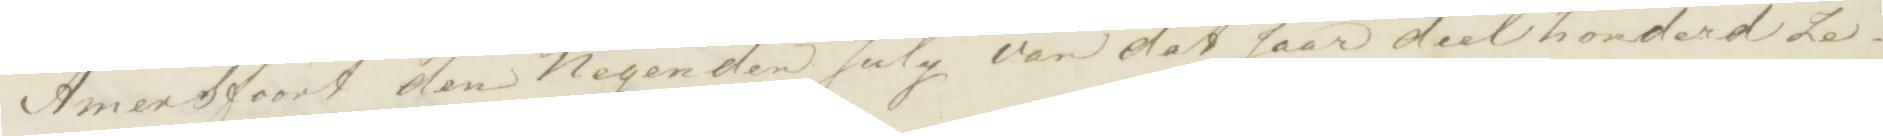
Amersfoort den Negenden July van dat jaar deel honderd ze„
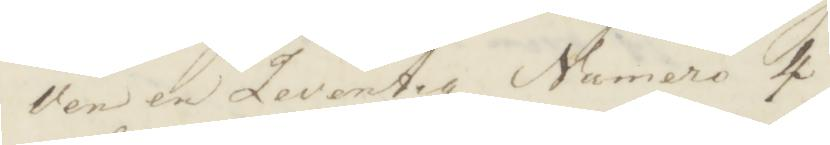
ven en zeventig Numero 4
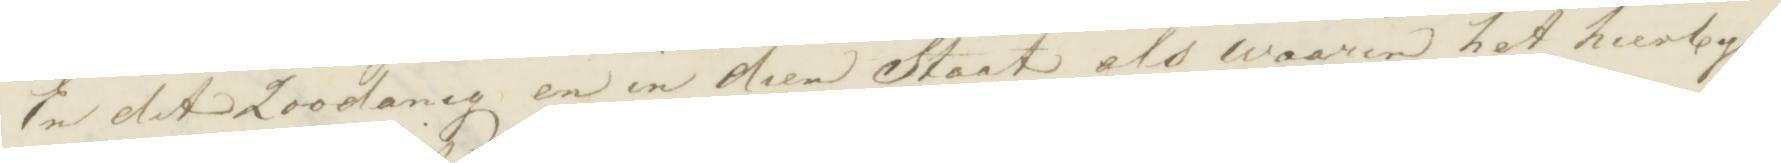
En dit zoodanig en in dien staat als waarin het hierby
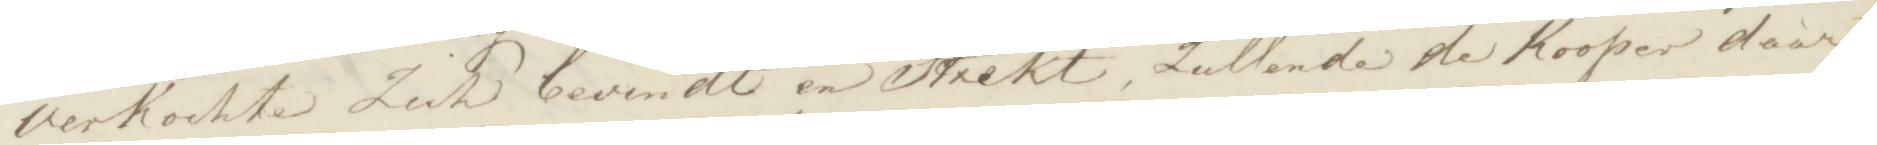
verkochte zich bevindt en strekt, zullende de kooper daar
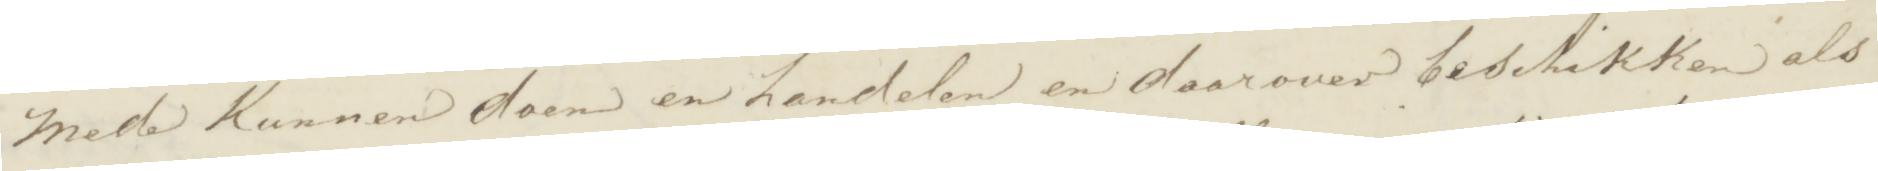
mede kunnen doen en handelen en daarover beschikken als
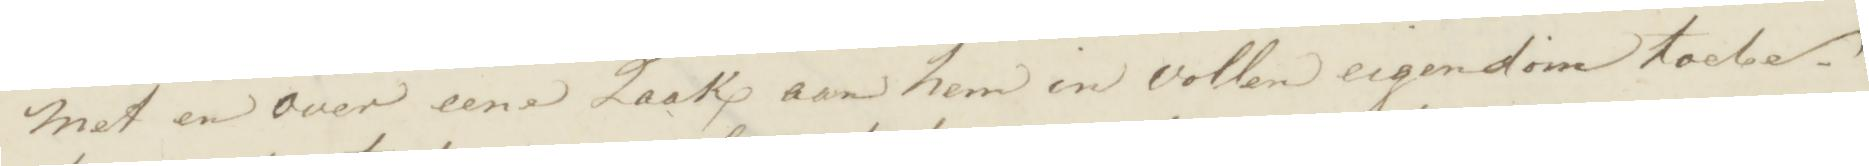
met en over eene zaak aan hem in vollen eigendom toebe-
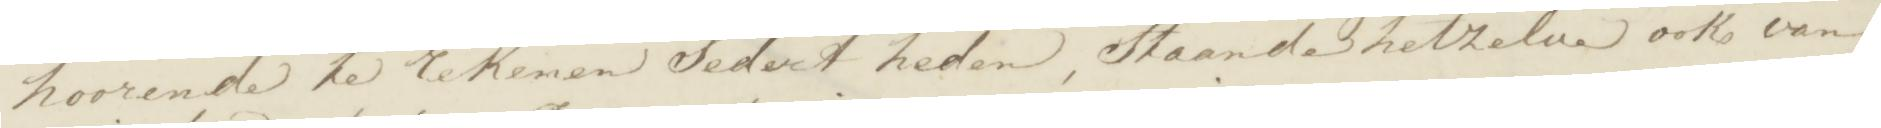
hoorende te rekenen sedert heden, staande hetzelve ook van
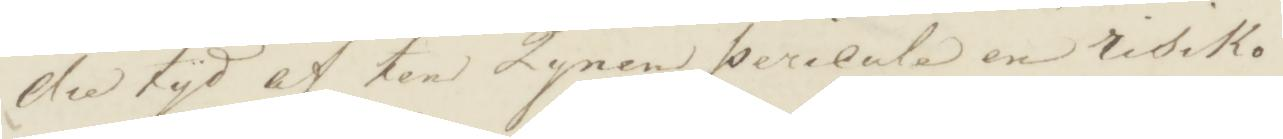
die tijd af ten zynen pericule en risiko
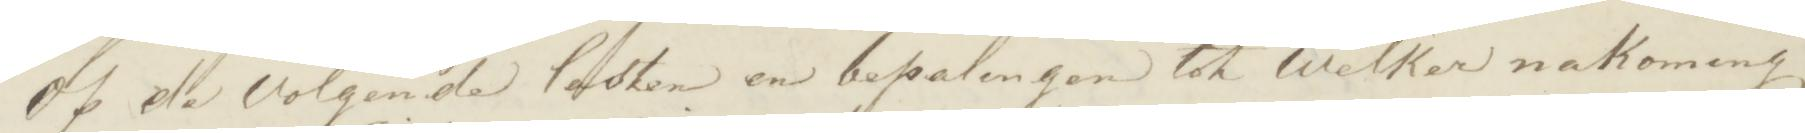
Op de volgende lasten en bepalingen tot welker nakoming
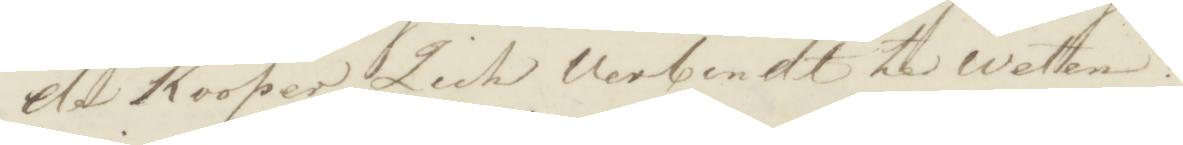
de kooper zich verbindt te weten:
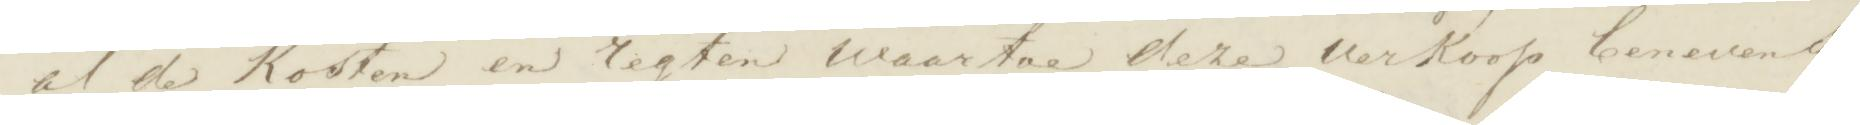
al de kosten en regten waartoe deze verkoop benevens
